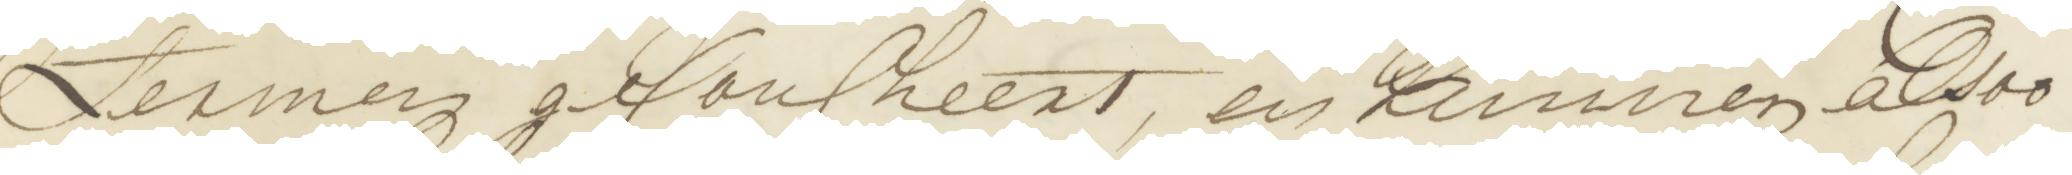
termen geconcheert, en kunnen alsoo
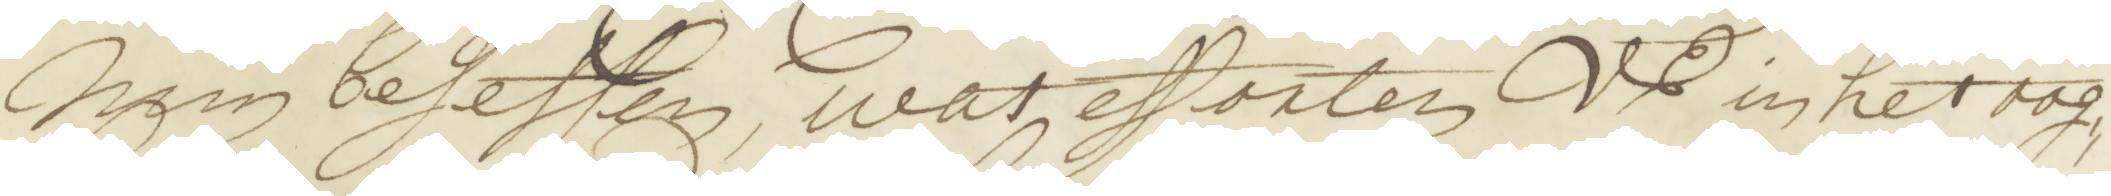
min beseffen, wat efforten VE in het oog„
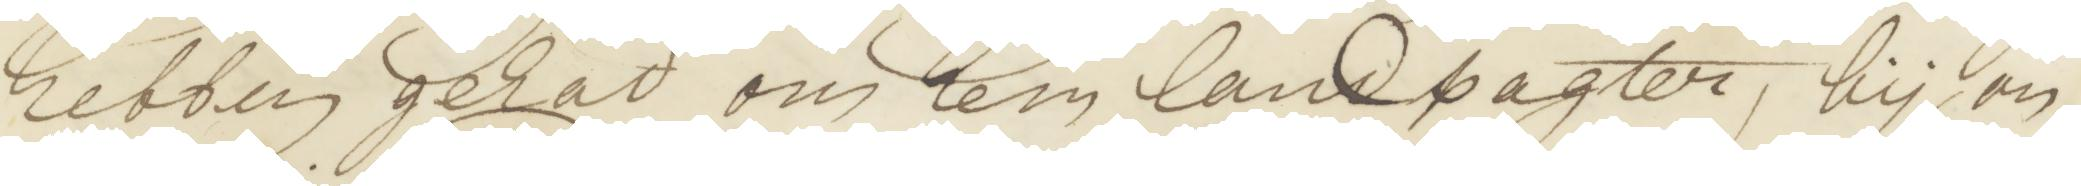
hebben gehad om hem landpagter, bij on
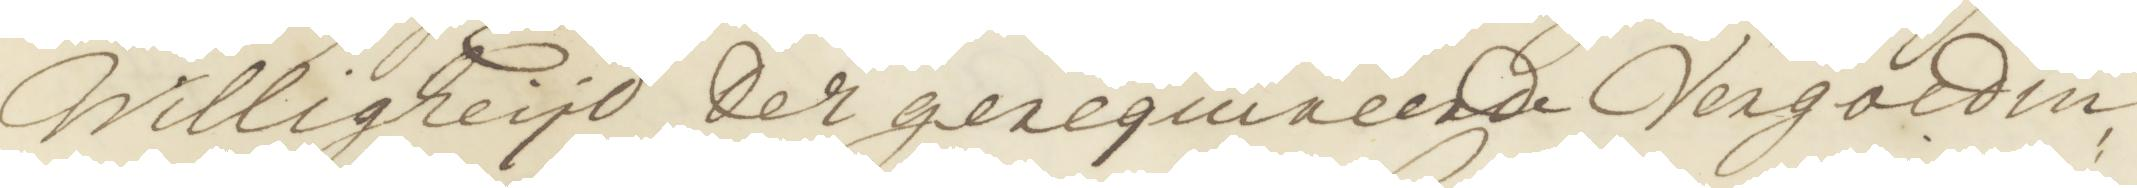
Willigheijd der gerequireerde Vergoedin„
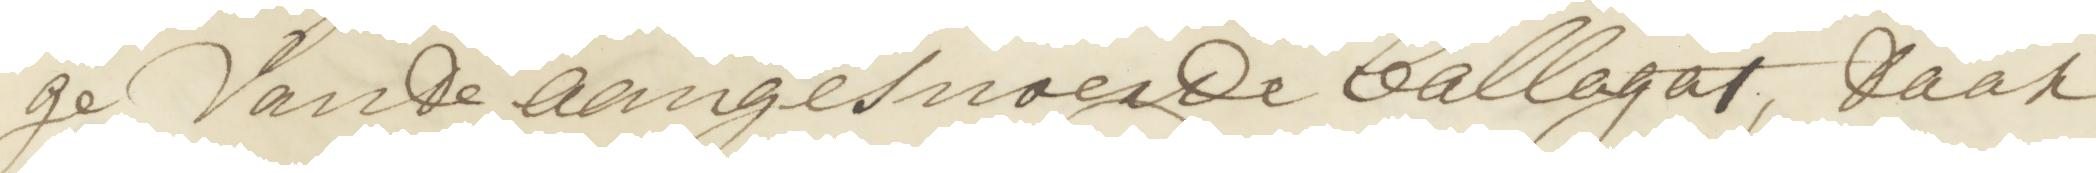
ge, van de aangesnoerde ballagat, daar
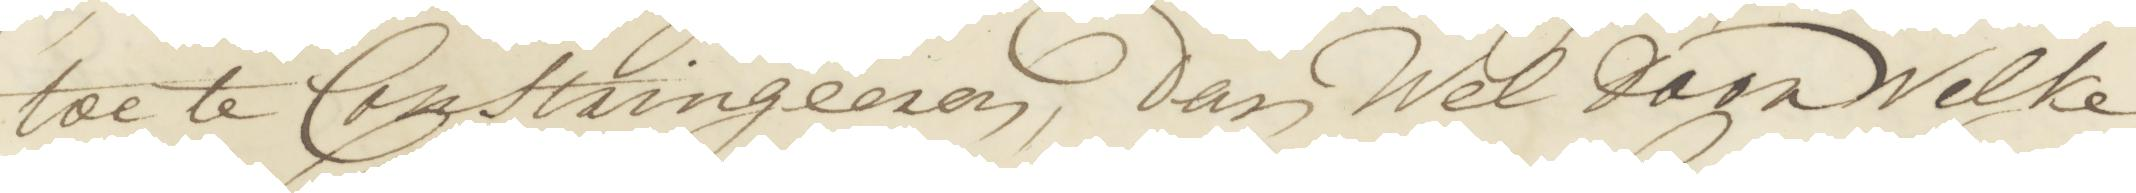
toe te constringeeren, dan wel door welke,
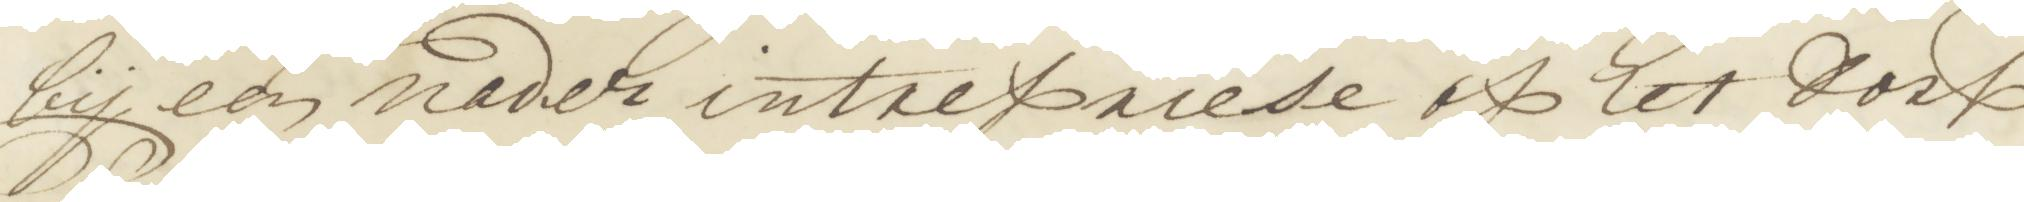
bij een nader intrepriese op het dorp
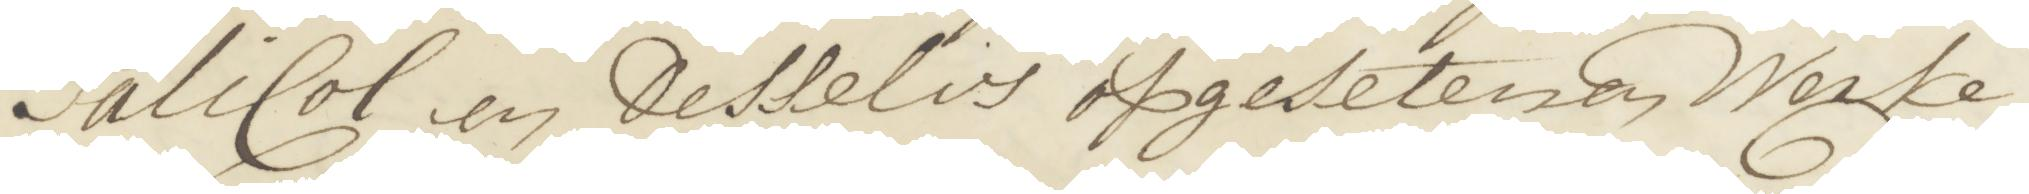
Palicol en desselvs opgesetenen werke
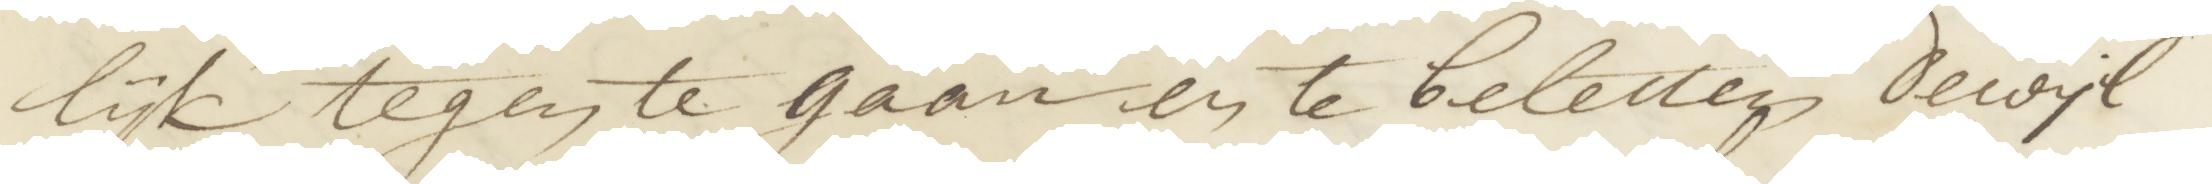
lijk tegen te gaan en te beletten dewijl
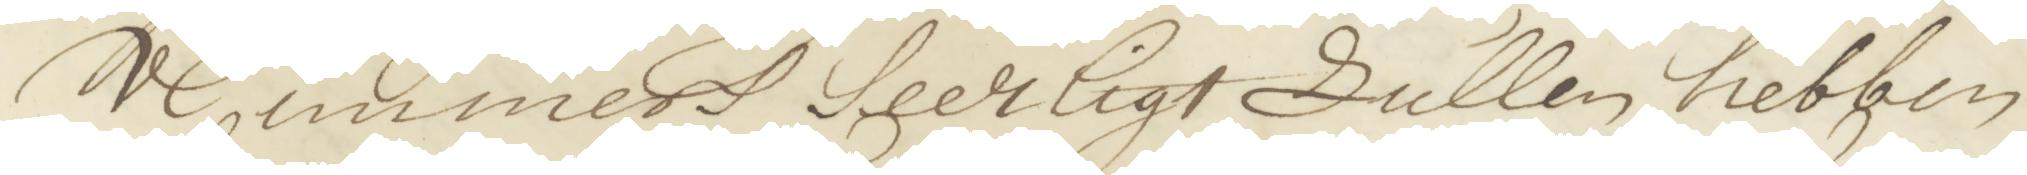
VE immers seer ligt zullen hebben
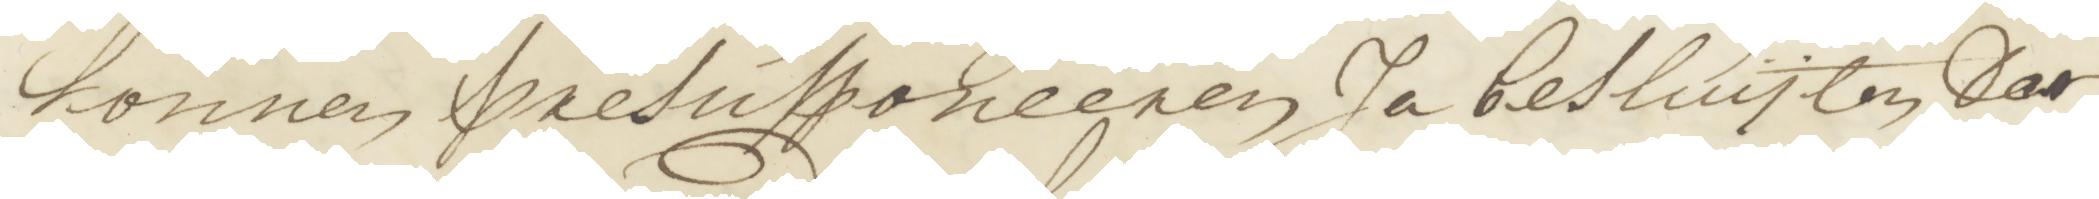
konnen presupponeeren Ja besluijten, dat
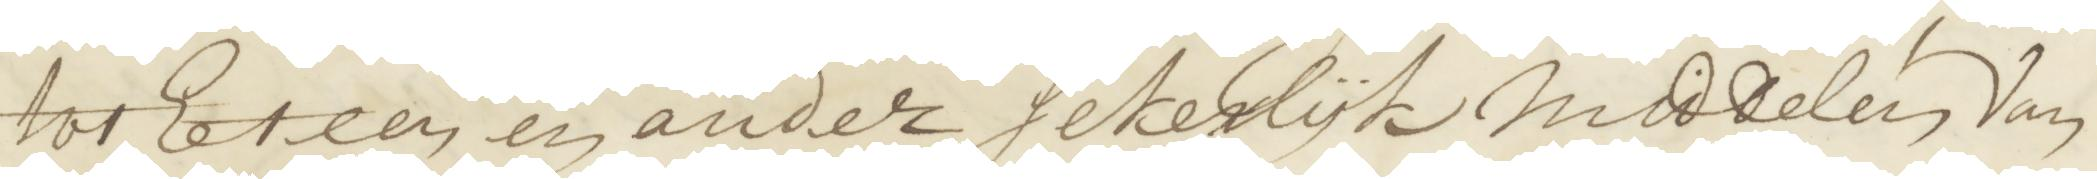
tot het een en ander sekerlijk middelen van
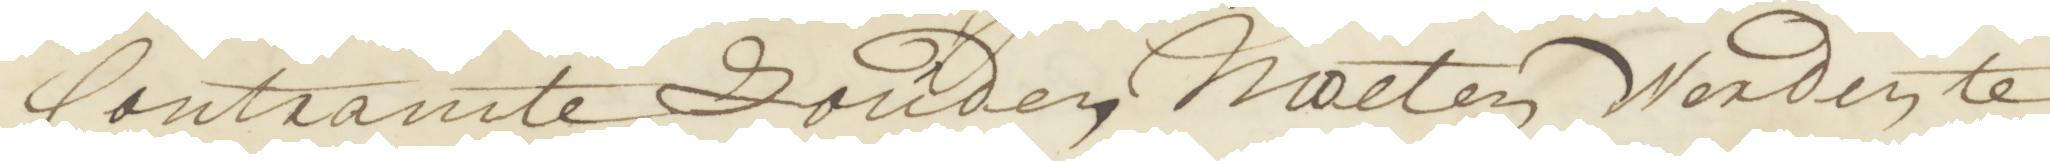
Contrainte zouden moeten werden te
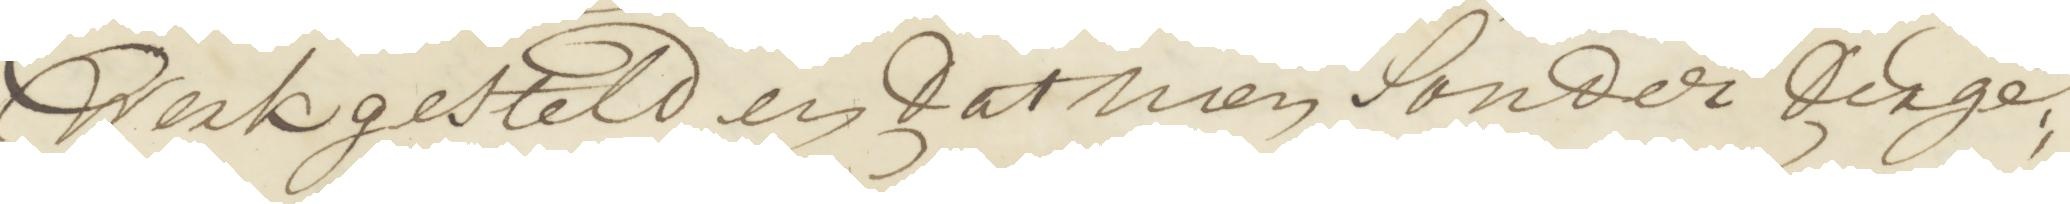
werk gesteld en dat men sonder derge„
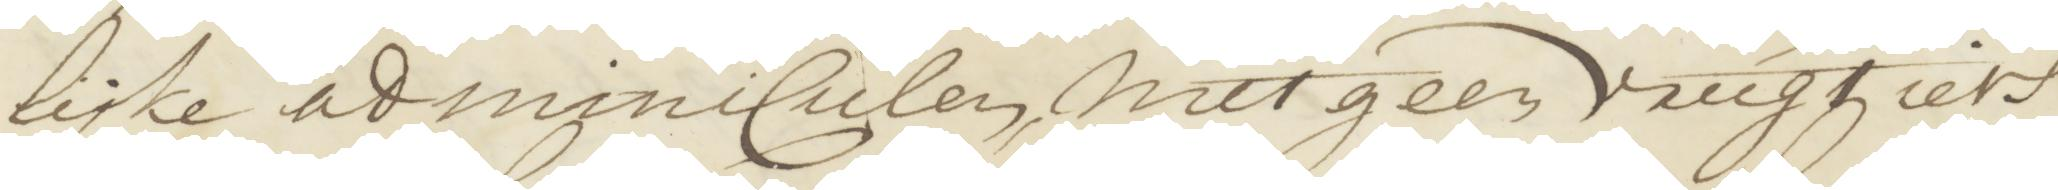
lijke adminiculen, met geen vrugt iets
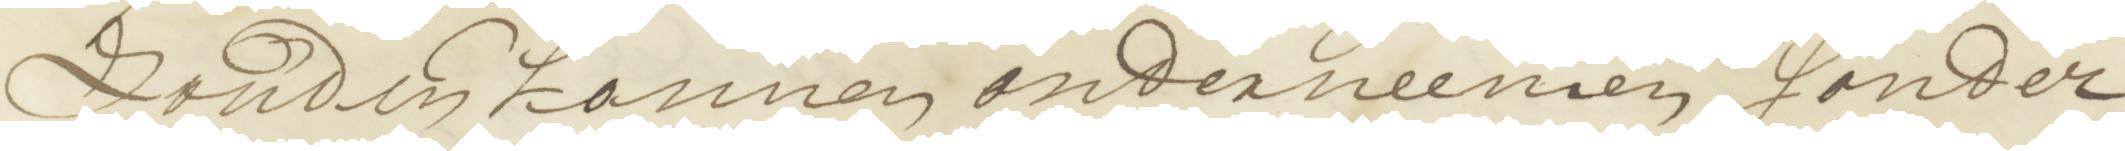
zouden konnen onderneemen, sonder
